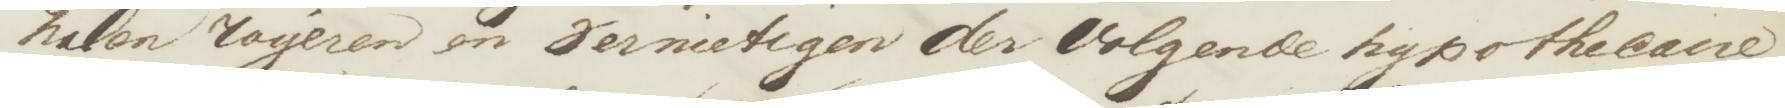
halen roijeren en vernietigen der volgende hijpothecaire
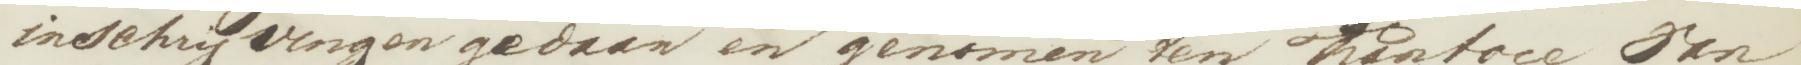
inschrijvingen gedaan en genomen ten kantore van
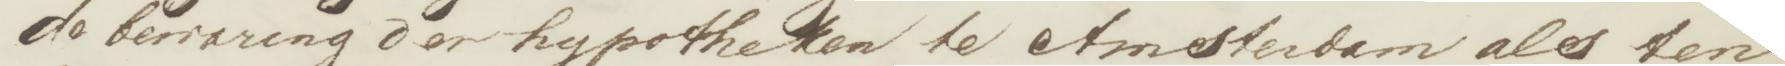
de bewaring der hypotheken te Amsterdam als ten
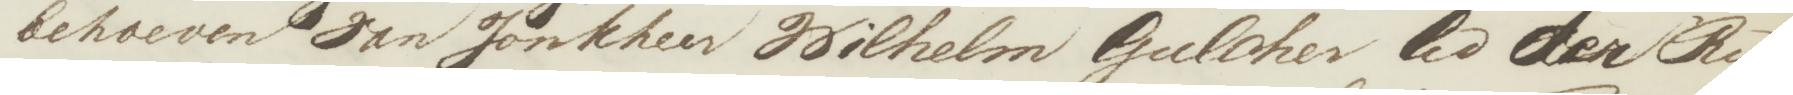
behoeven van Jonkheer Wilhelm Gulcher lid der Rid
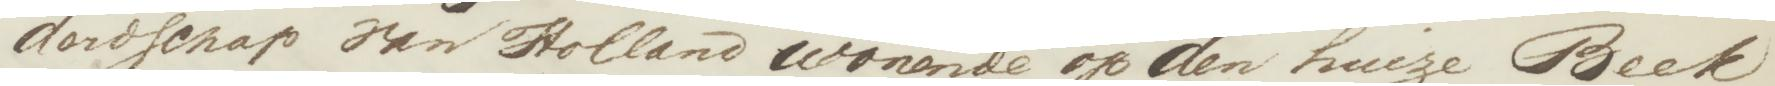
derdschap van Holland wonende op den huize Beek
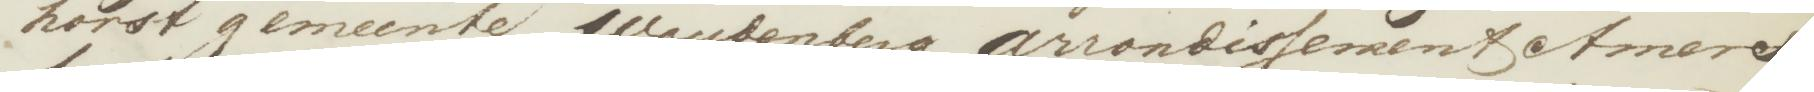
horst gemeente Woudenberg Arrondissement Amers
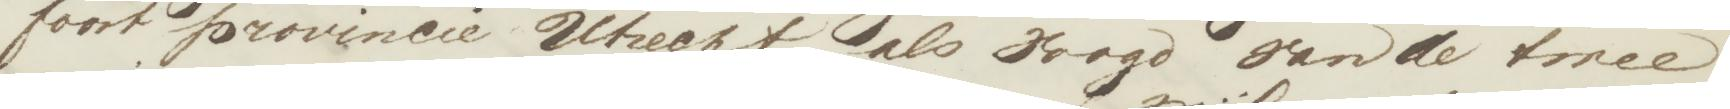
foort provincie Utrecht als voogd van de twee
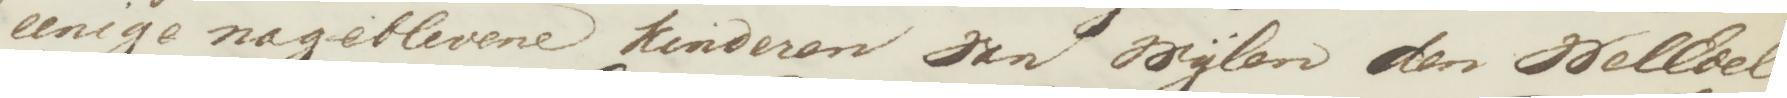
eenige nageblevene kinderen van wijlen den WelEdel
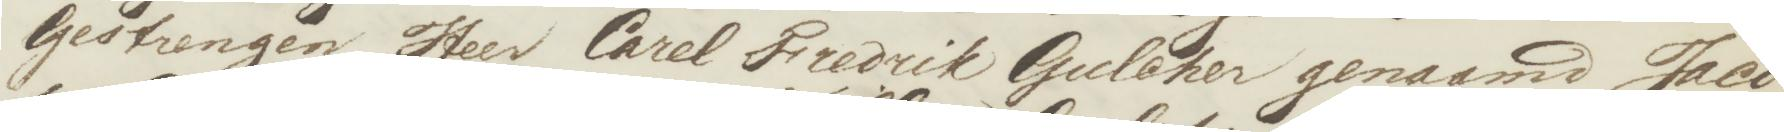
Gestrengen Heer Carel Fredrik Gulcher genaamd Jaco
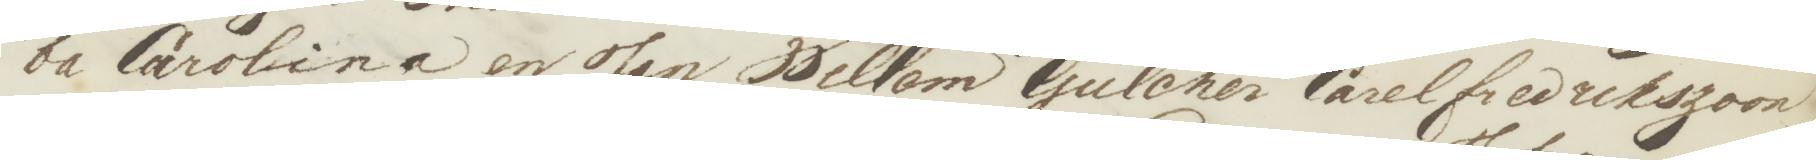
ba Carolina en Jan Willem Gulcher Carelfredrikszoon
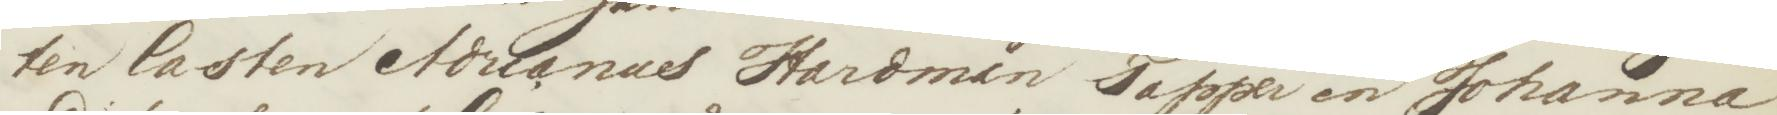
ten lasten Adrianus Hardman Tapper en Johanna
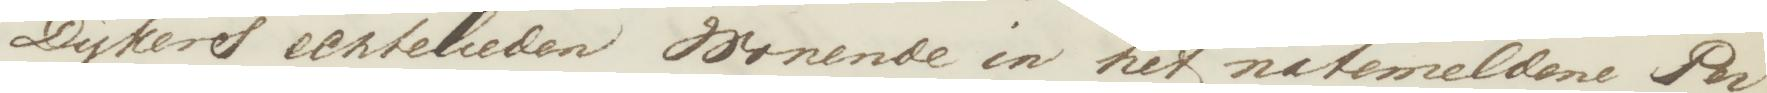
Dijkers echtelieden wonende in het natemeldene Per
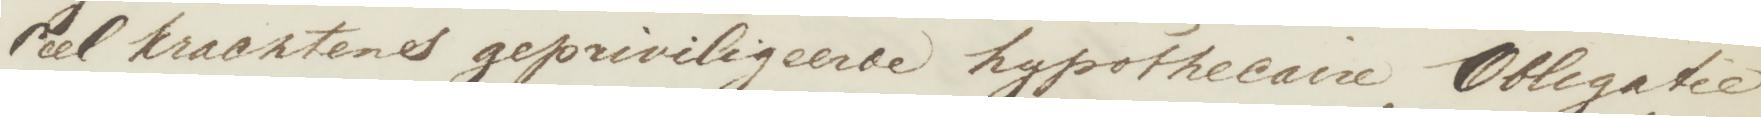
ceel krachtens gepriviligeerde hypothecaire Obligatie
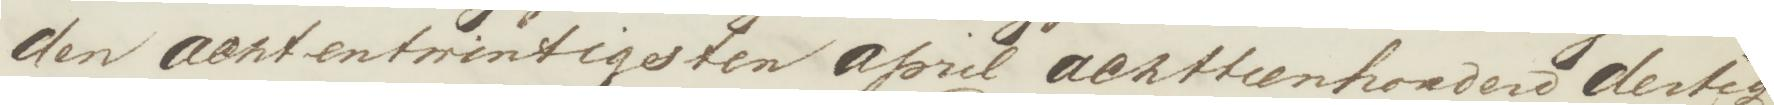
den achtentwintigsten april achttienhonderd dertig
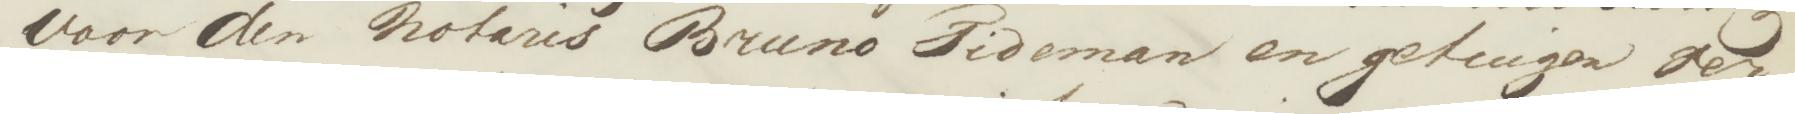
voor den notaris Bruno Tideman en getuigen ver
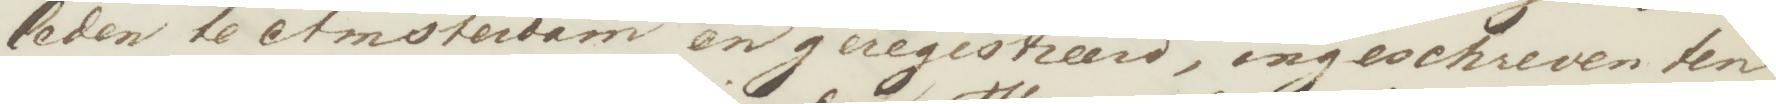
leden te Amsterdam en geregistreerd, ingeschreven ten
